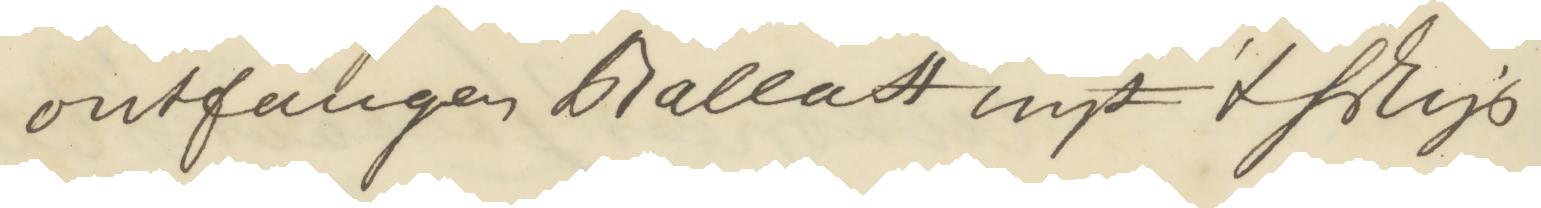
ontfangen Ballast uijt 't schip
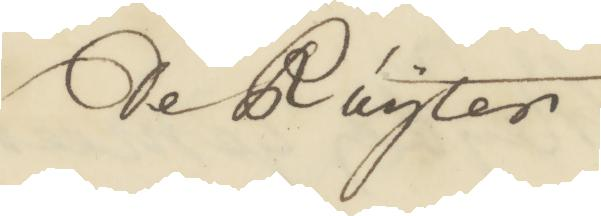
de Ruijter.
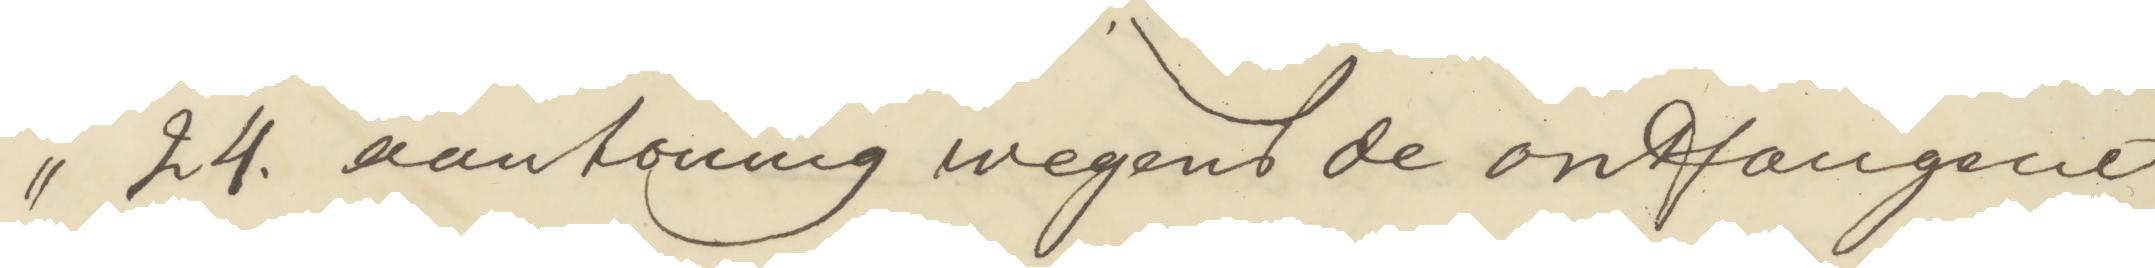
„ 24. aantoning wegens de ontfangene
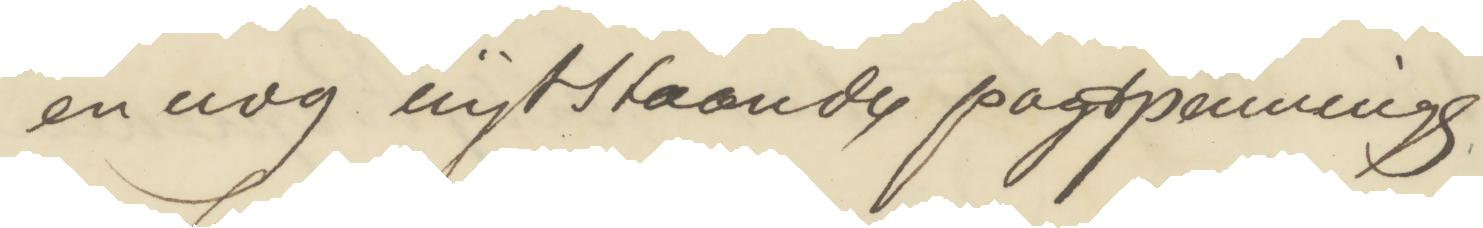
en nog uijtstaande pagtpenningh
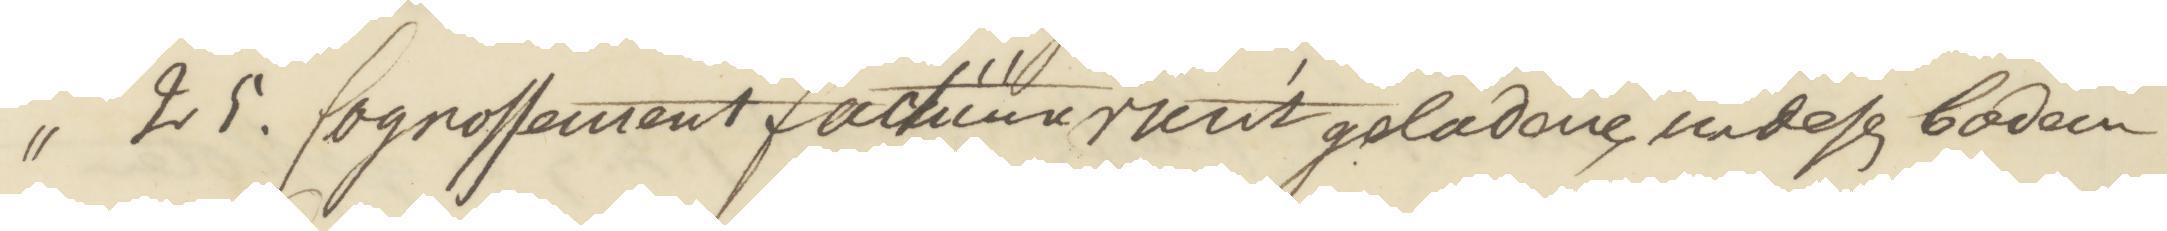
„ 25. Cognossement factuur van't geladene indesen bodem
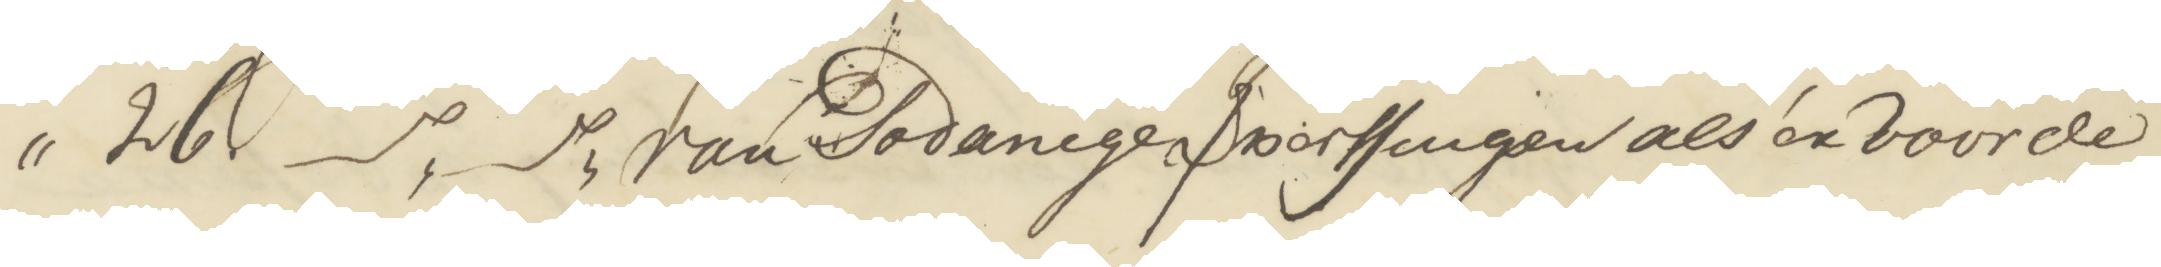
„ 26. _„o _„o van sodanige ververssingen als 'er voor de
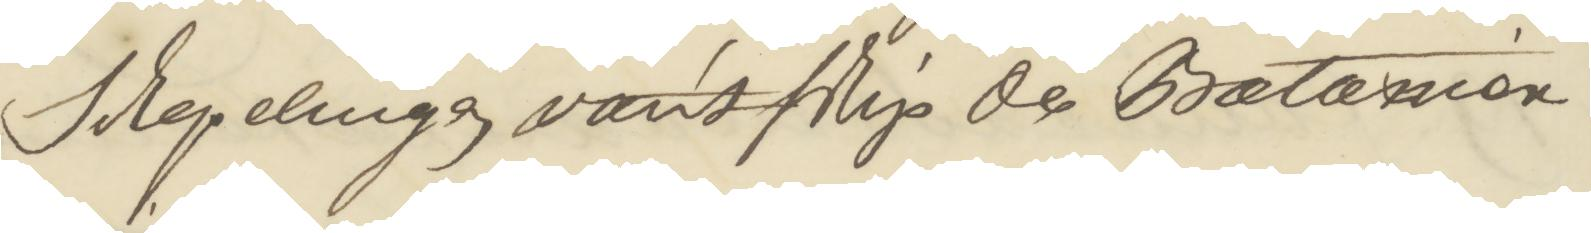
schepelingen van't schip de Batavier
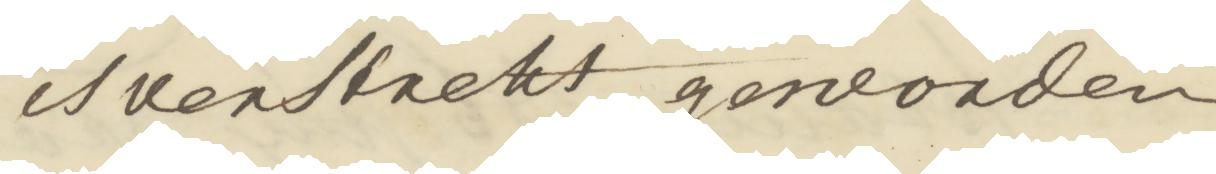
is verstrekt geworden
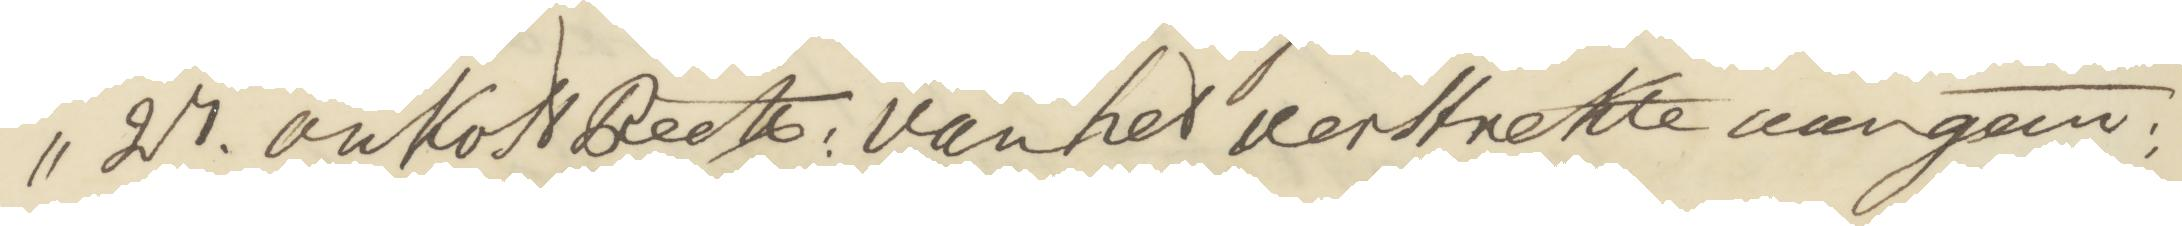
„ 27. onkost Reek: van het verstrekte aan gem:
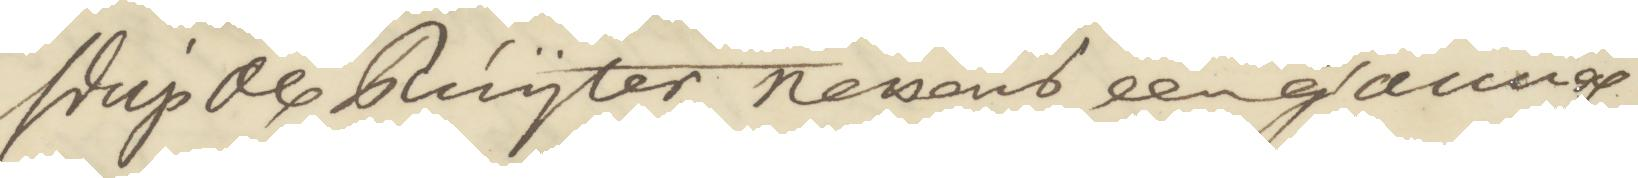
schip de Ruijter nevens een g'annex
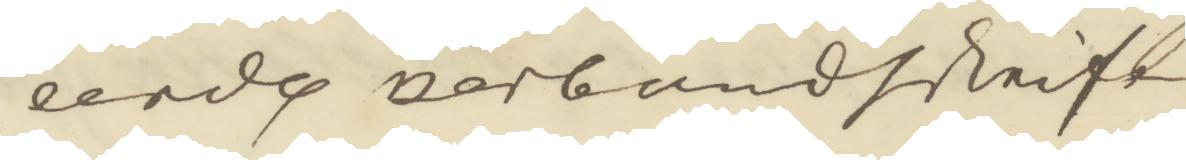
eerde verbandschrift
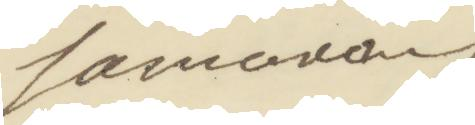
samarang
